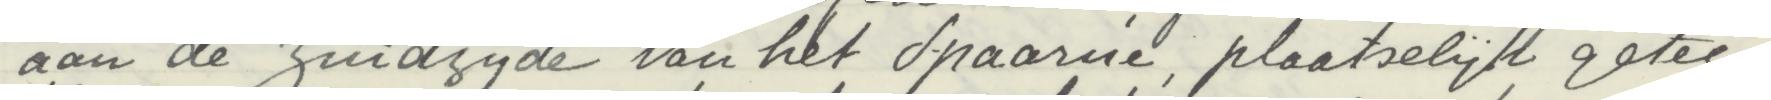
aan de Zuidzijde van het Spaarne, plaatselijk getee-
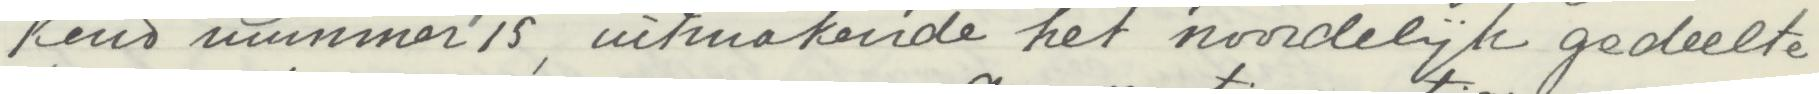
kend nummer 15, uitmakende het noordelijk gedeelte
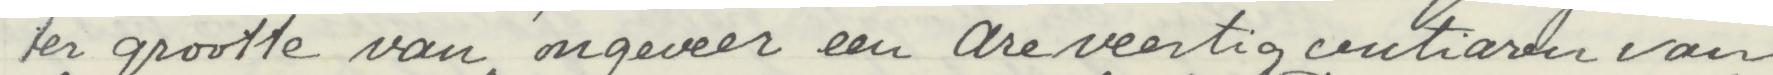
ter grootte van ongeveer een are veertig centiaren van
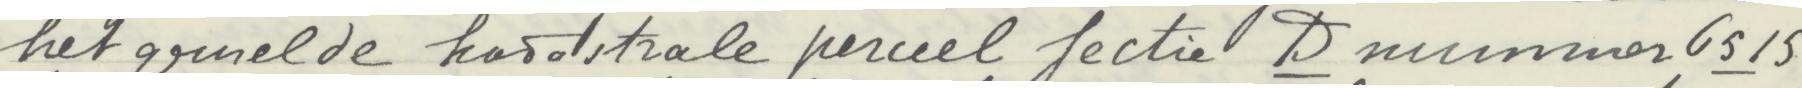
het gemelde kadastrale perceel sectie D nummer 6515
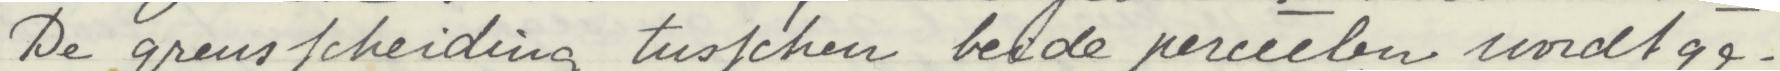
De grensscheiding tusschen beide perceelen wordt ge-
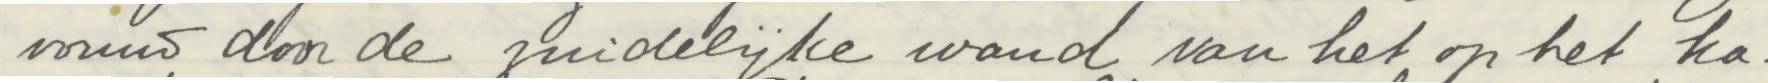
vormd door de zuidelijke wand van het op het ka
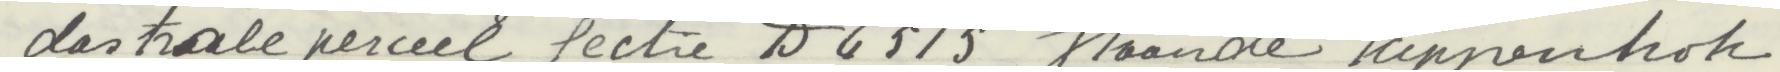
dastrale perceel sectie D6515 staande kippenhok
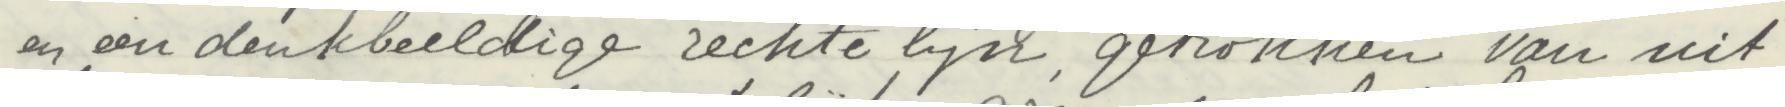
en een denkbeeldige rechte lijn, getrokken van uit
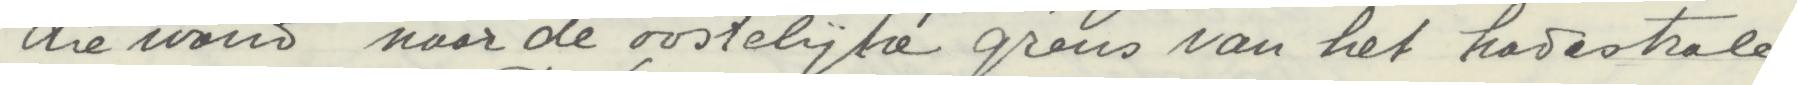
die wand voor de oostelijke grens van het kadastrale
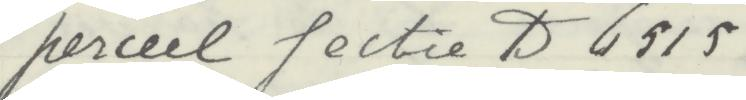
perceel sectie D 6515
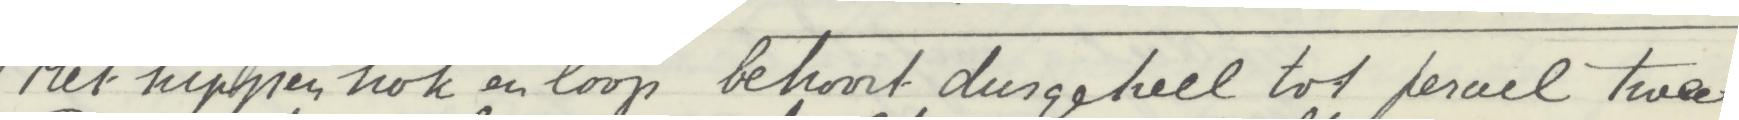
Het kippen hok en loop behoort dus geheel tot perceel twee
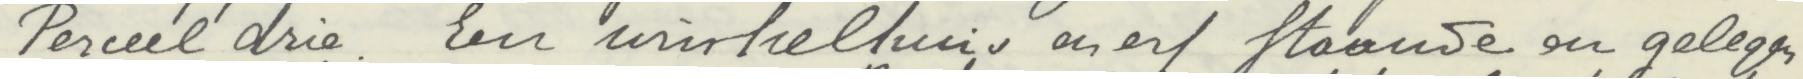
Perceel drie. Een winkelhuis en erf staande en gelegen
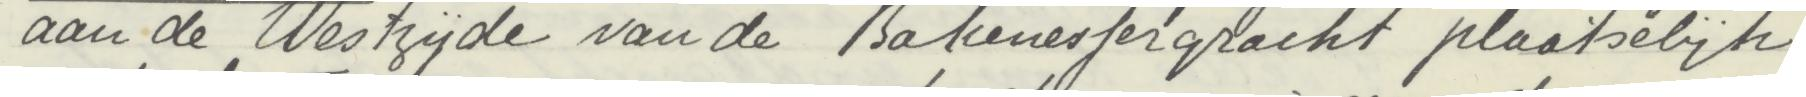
aan de Westzijde van de Bakenessergracht plaatselijk
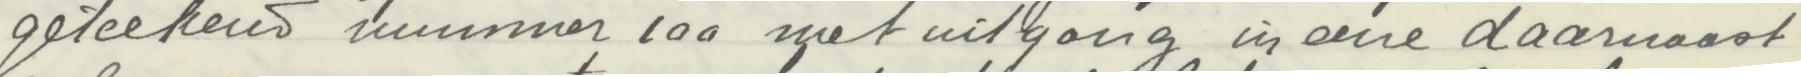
geteekend nummer 100 met uitgang in eene daarnaast
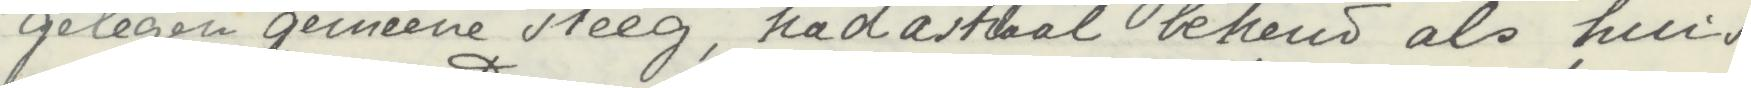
gelegen gemeene steeg, kadastraal bekend als huis
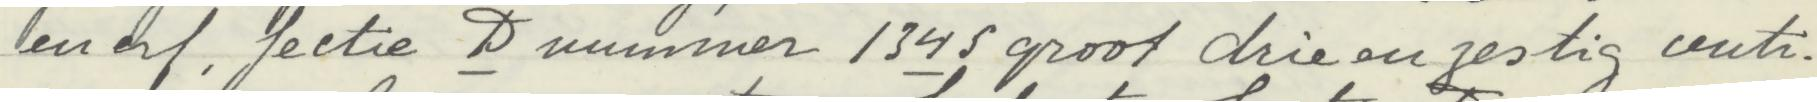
en erf, sectie D nummer 1345 groot drie en zestig centi
